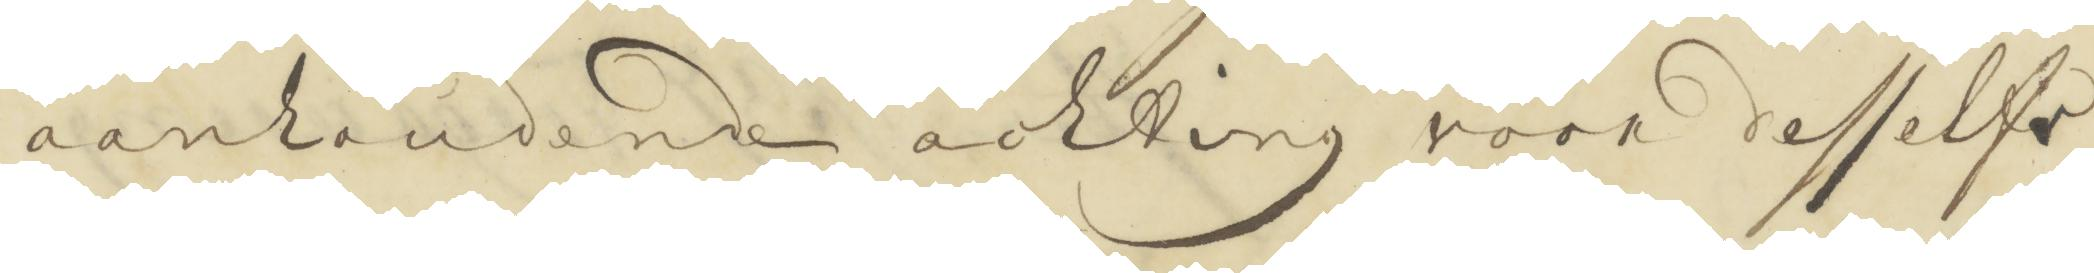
aanhoudende achting voor desselfs
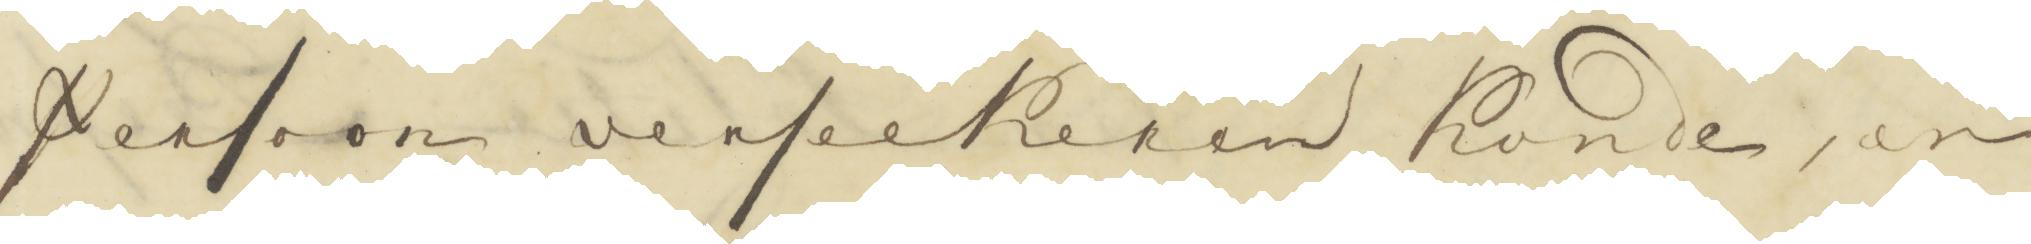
Persoon verseekeren konde, en
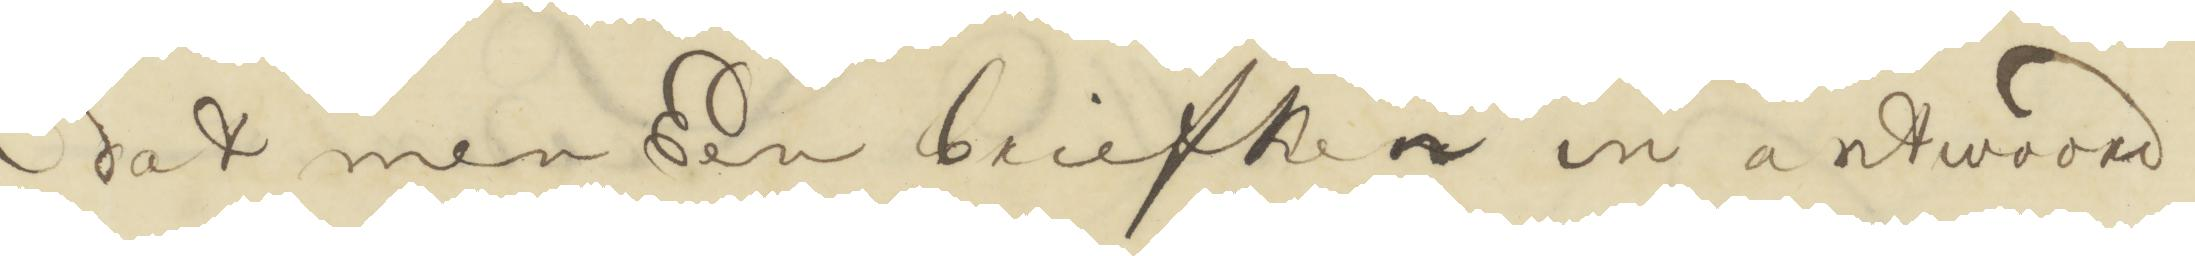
dat men den briefken in antwoord
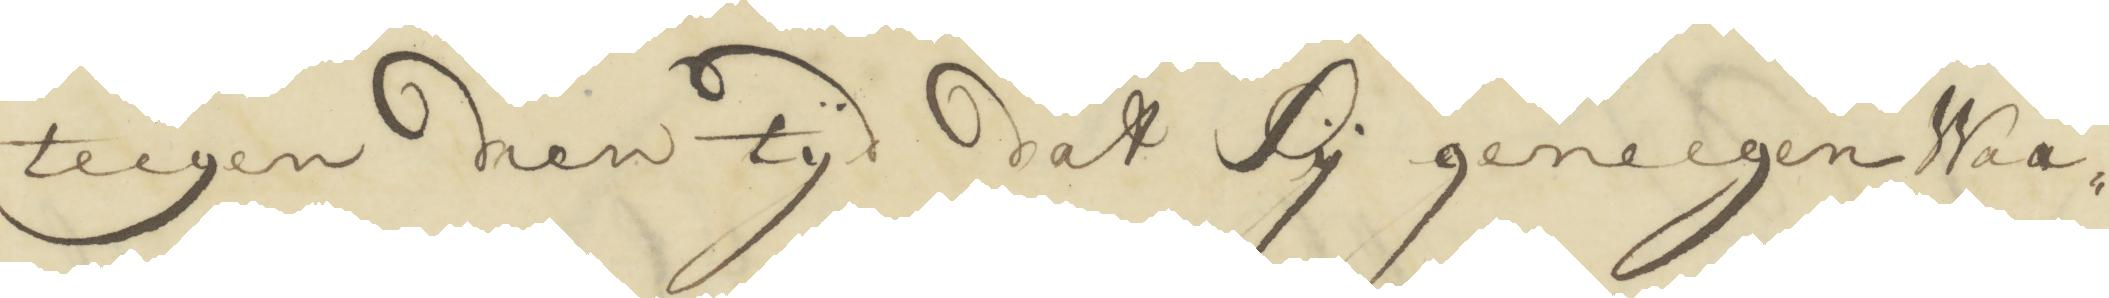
teegen dien tijd dat sij geneegen waa„
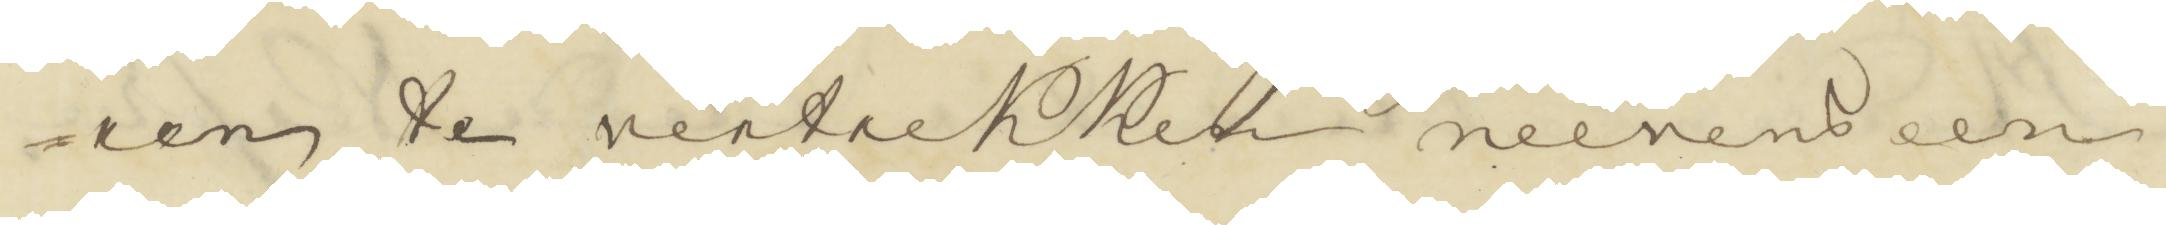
=ren te vertrekken neevens een
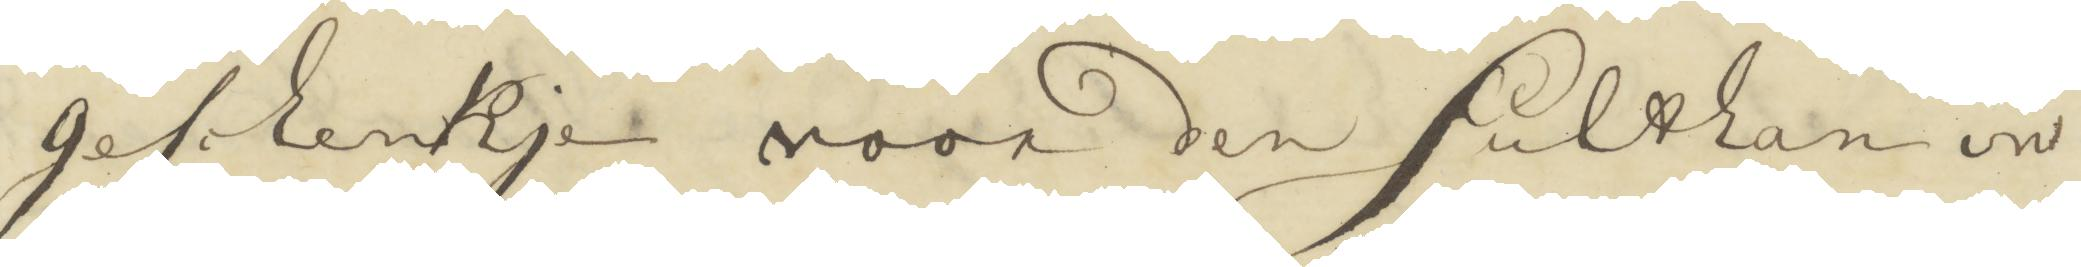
geschenkje voor den Sulthan in
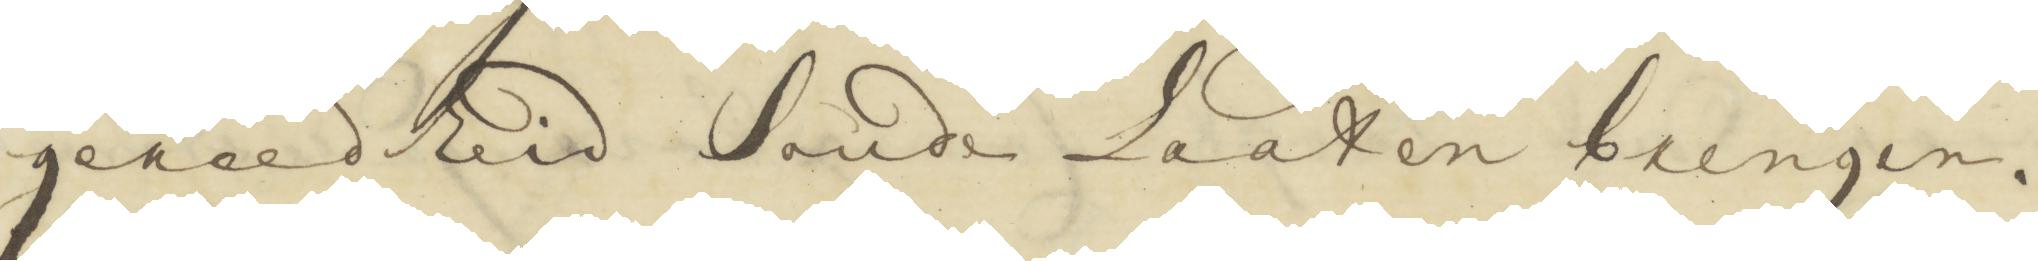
gereedheid soude laaten brengen.
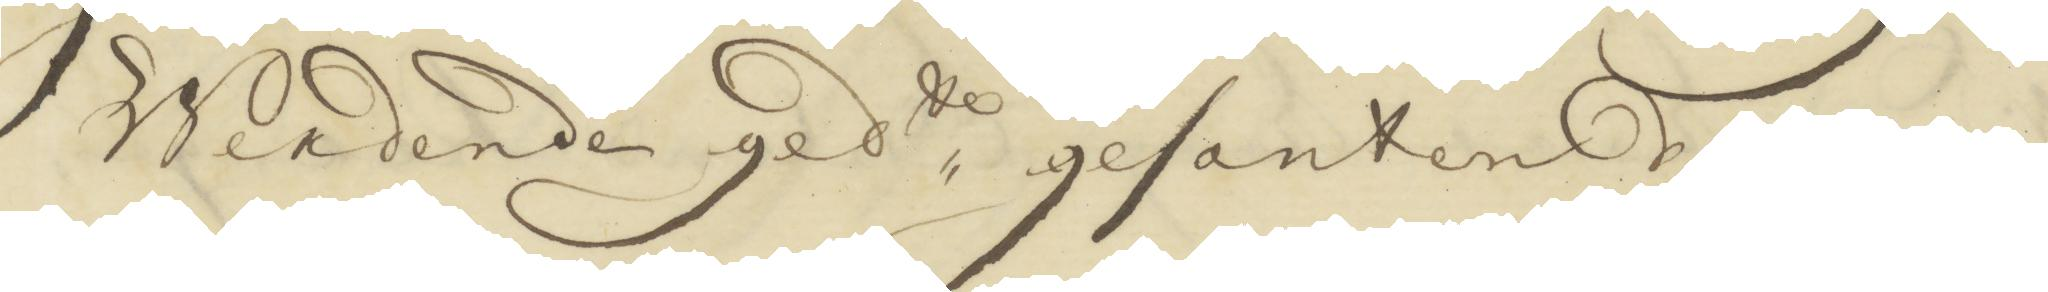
Werdende ged„te gesanten daar op
